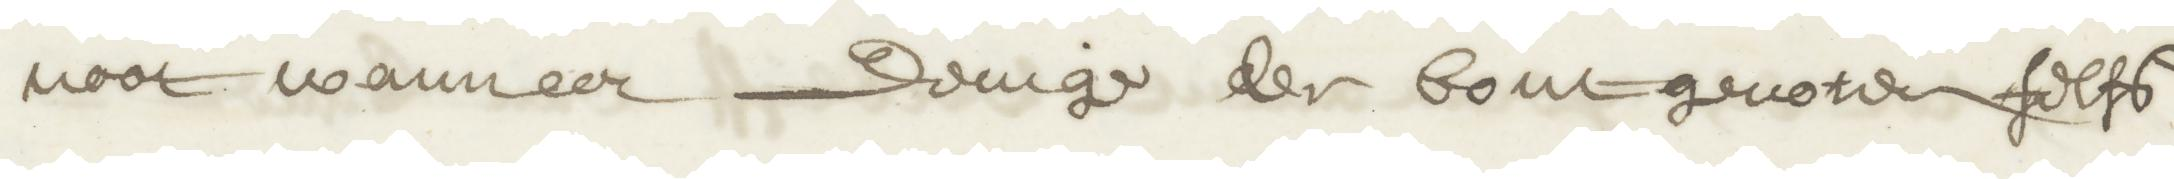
noot wanneer eenige der bontgenoten selfs
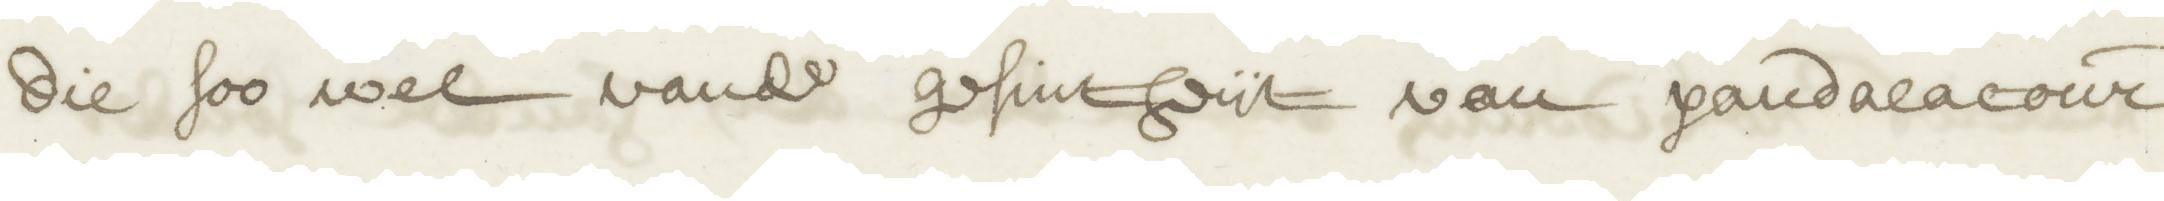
die soo wel vande gesintheijt van pandalacour
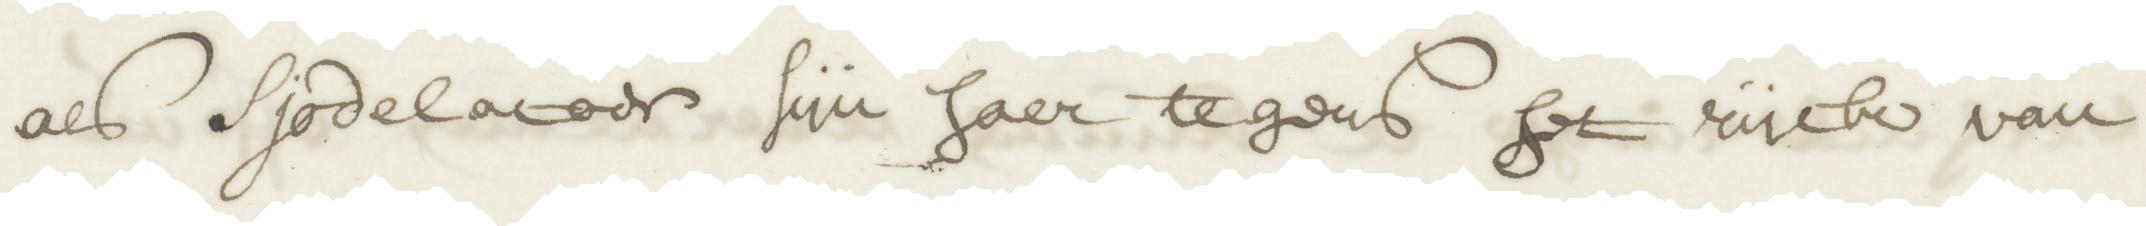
als sjodelacoer sijn haer tegens het rijck van
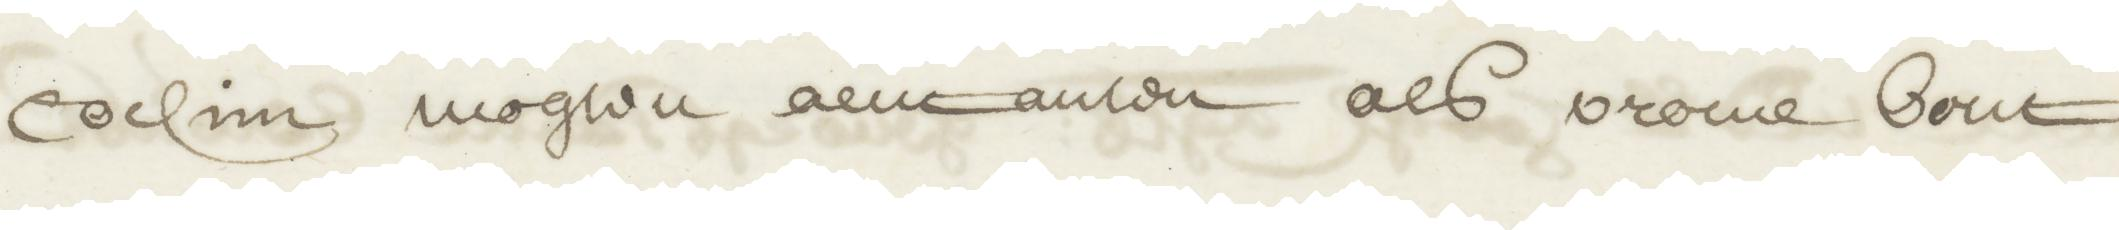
cochim mogten aencanten als vrome bont
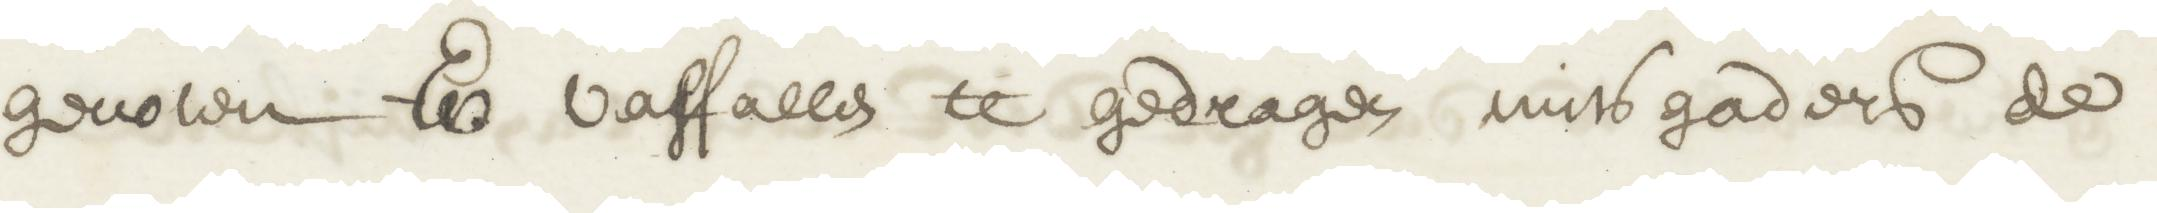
genoten En vassallen te gedragen mitsgaders de
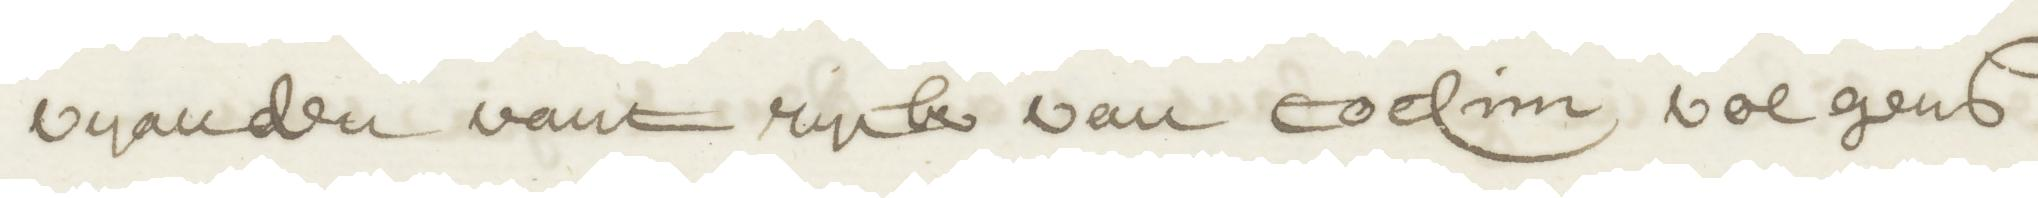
vyanden vant ryck van cochim volgens
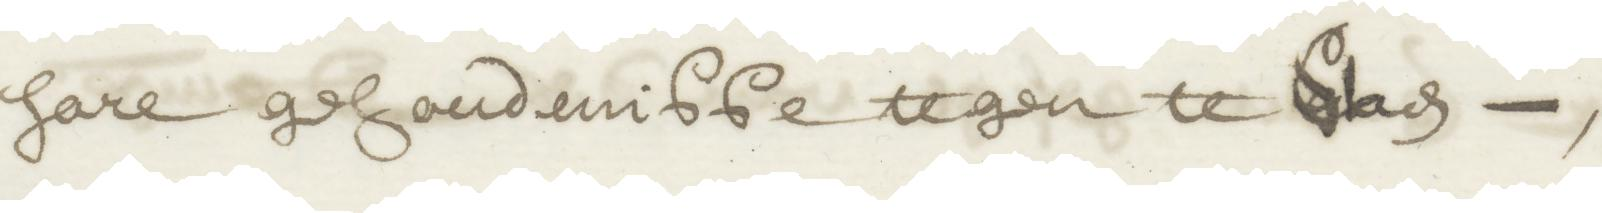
hare gehoudenisse tegen te staen —,
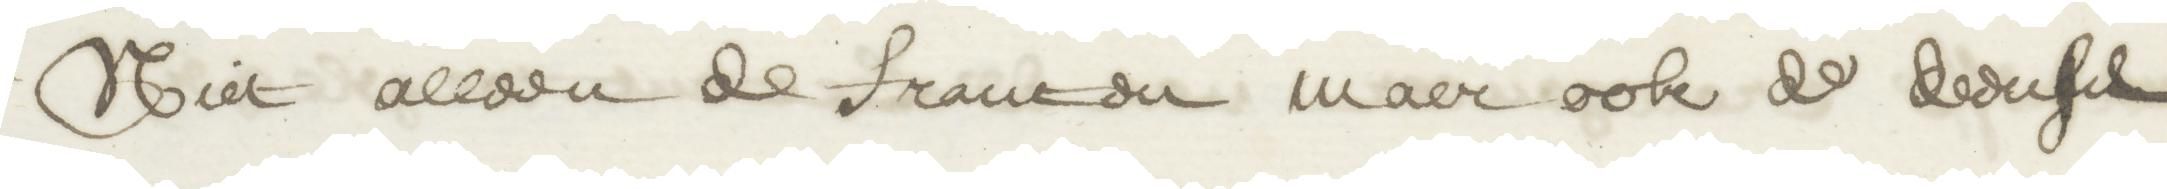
Niet alleen de francen maer ook de deensch
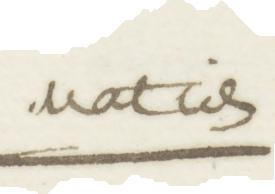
„natien
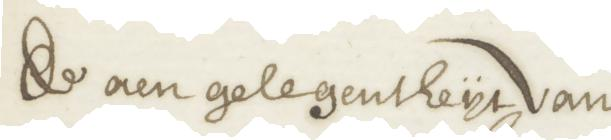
de aen gelegentheijt van
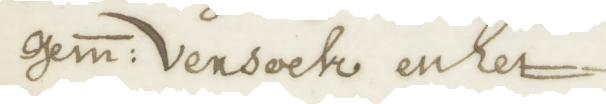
gem: versoek enhet
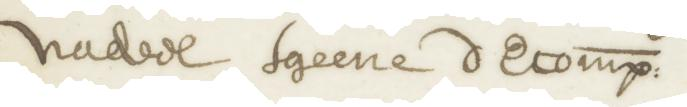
nadeel tgeene d Ecomp:
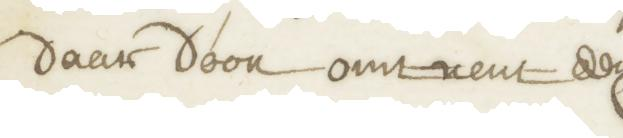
daar door omtrent den
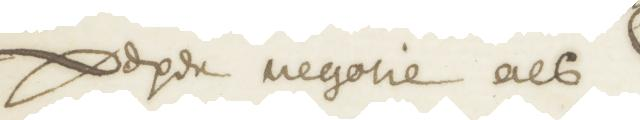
peper negotie als
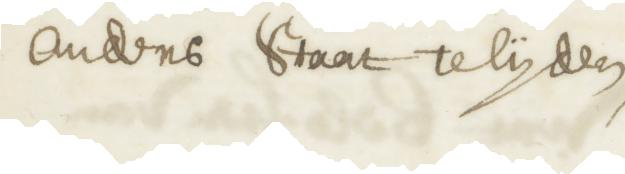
anders staat telijden.
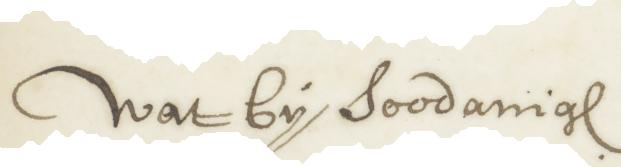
wat bij soodanigh
